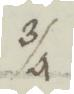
¾
